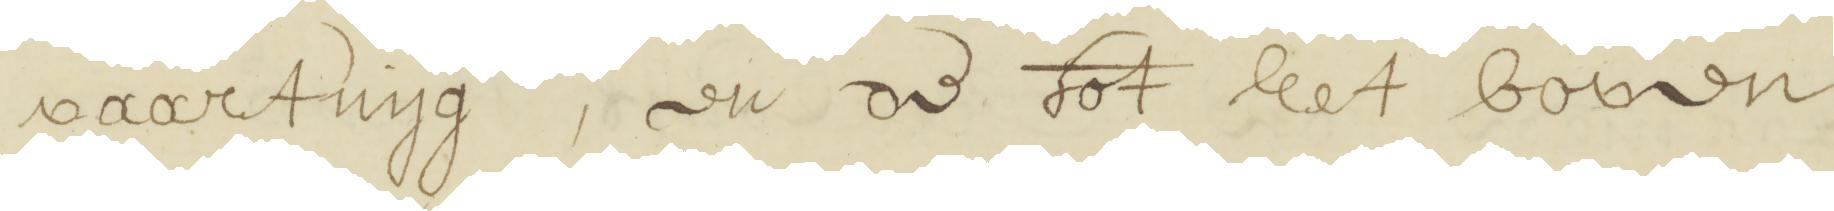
vaartuijg, en de tot het boven
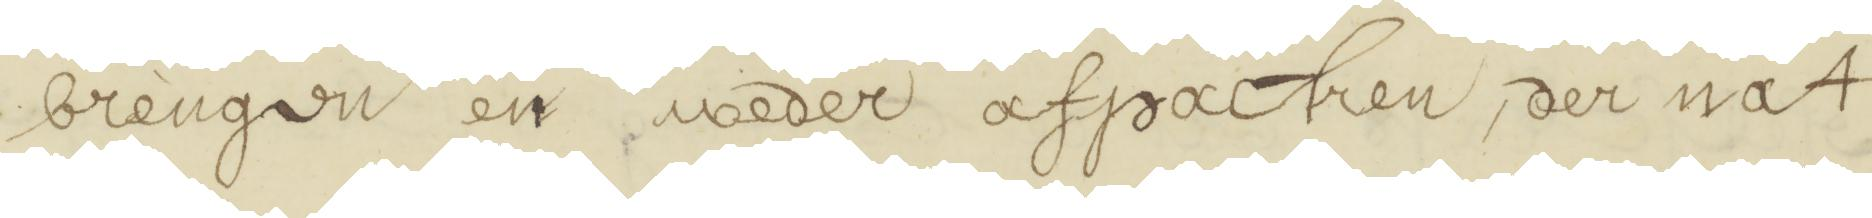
brengen en weder afpacken, der nat
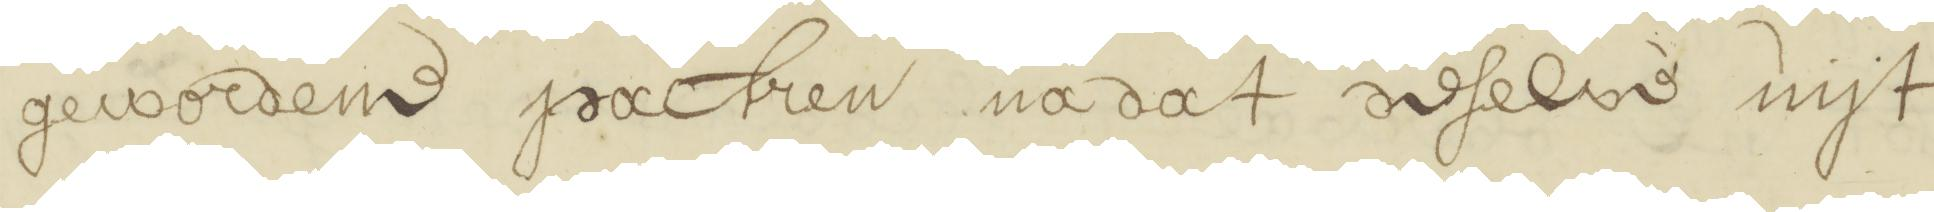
gewordene packen nadat deselve uijt
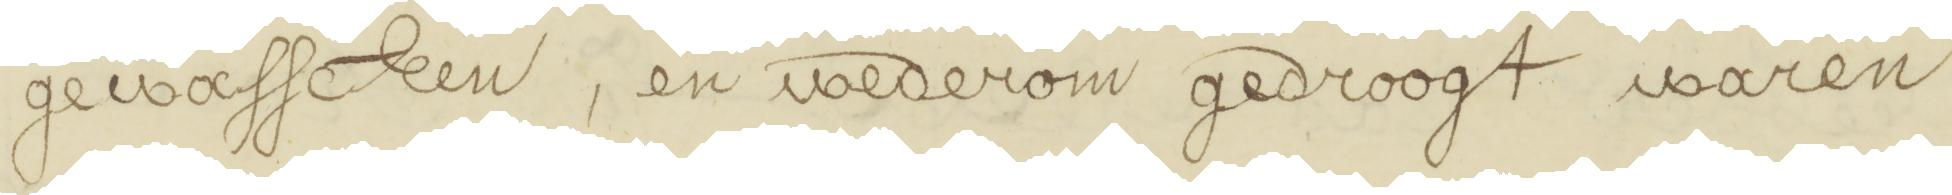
gewasschen, en wederom gedroogt waren
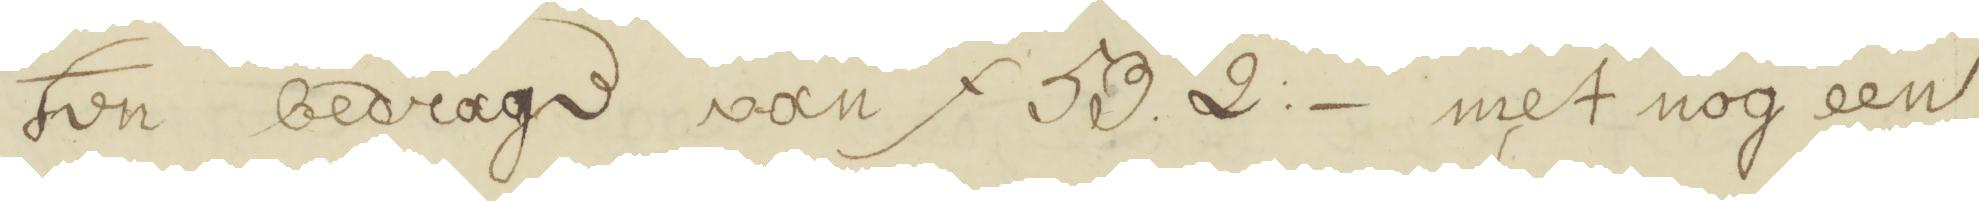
ten bedrage van ƒ 53.2:- met nog een
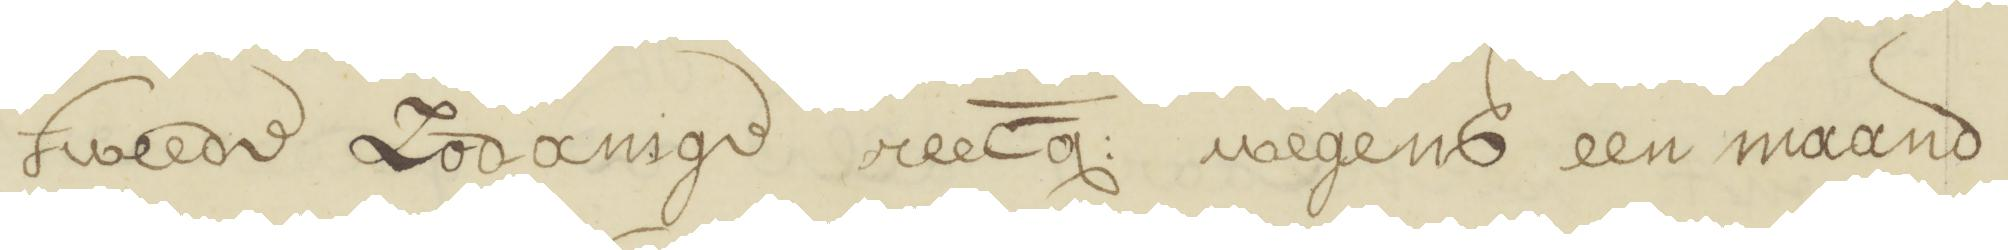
tweede zodanige reecq: wegens een maand
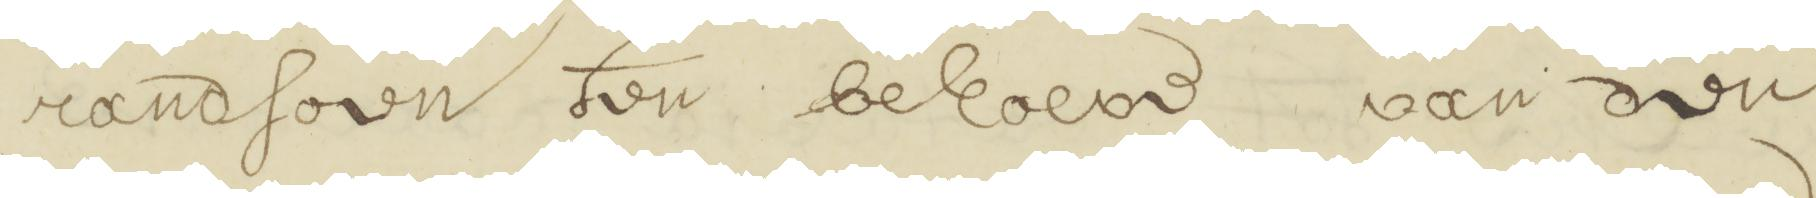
randsoen ten behoeve van den
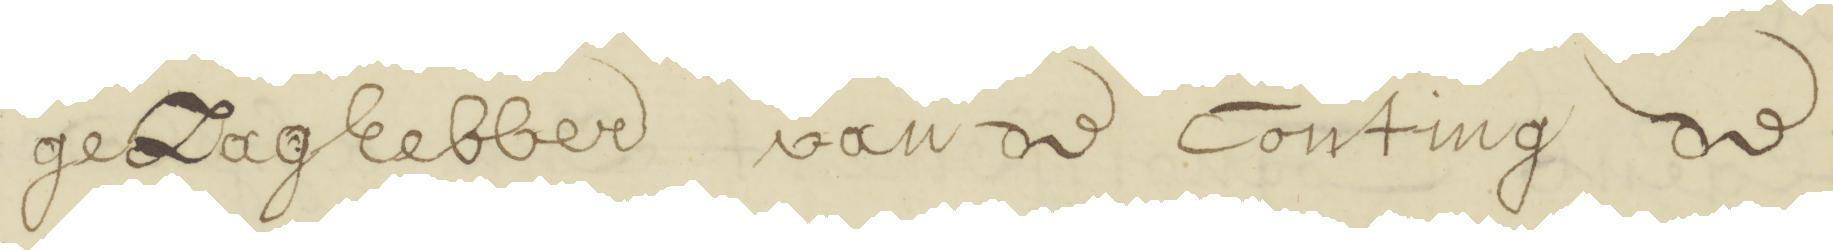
gezaghebber van de conting de
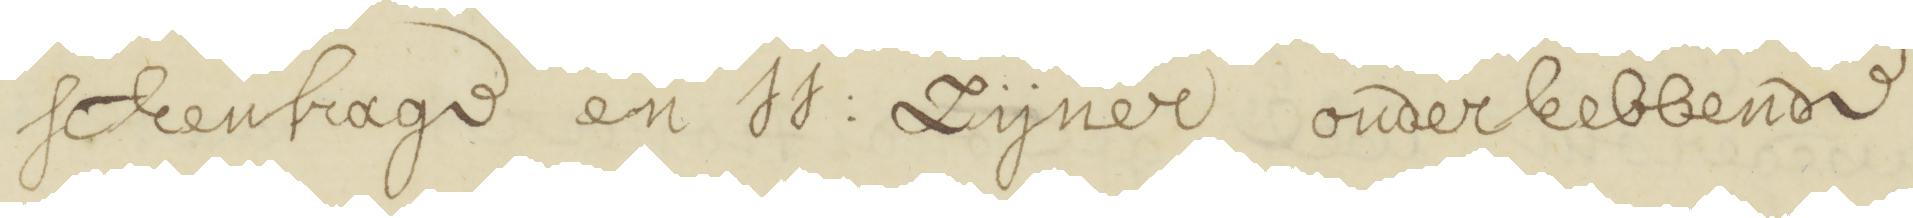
schenkage en 11: zijner onderhebbende
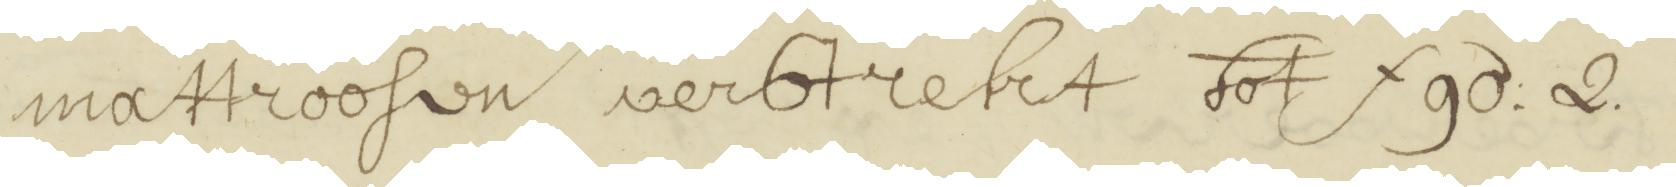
mattroosen verstrekt tot ƒ 98: 2:
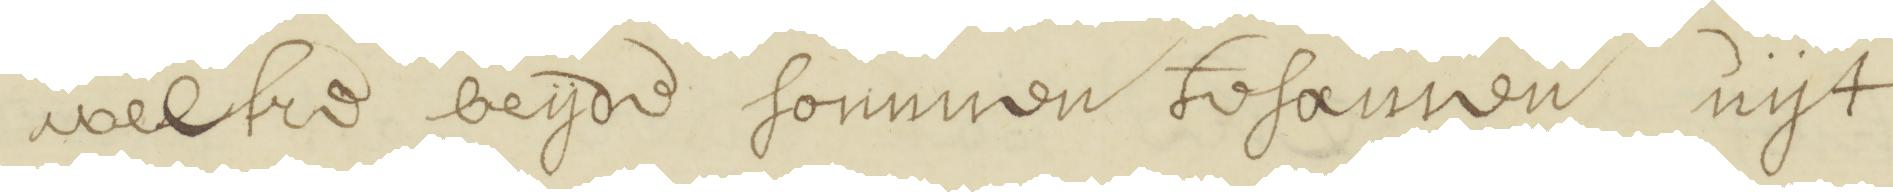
welke beijde sommen tesamen uijt
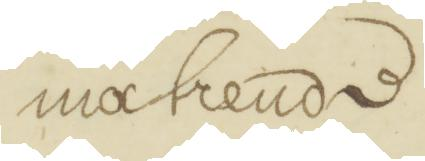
makende
